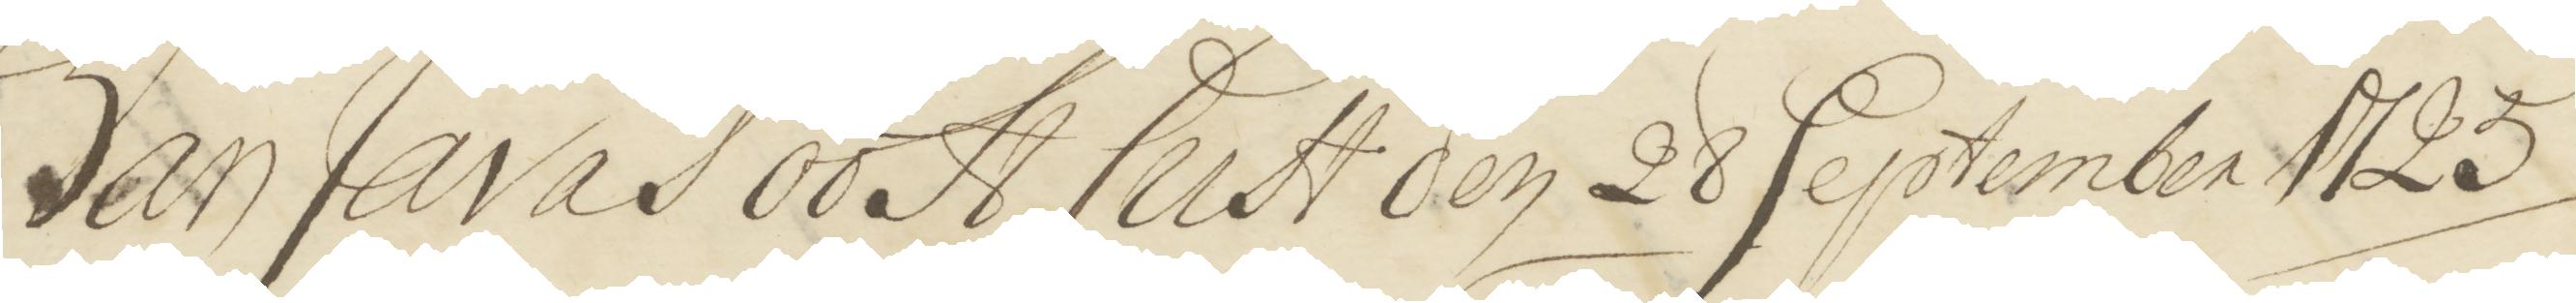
Van Java's oost Cust den 28 September 1723
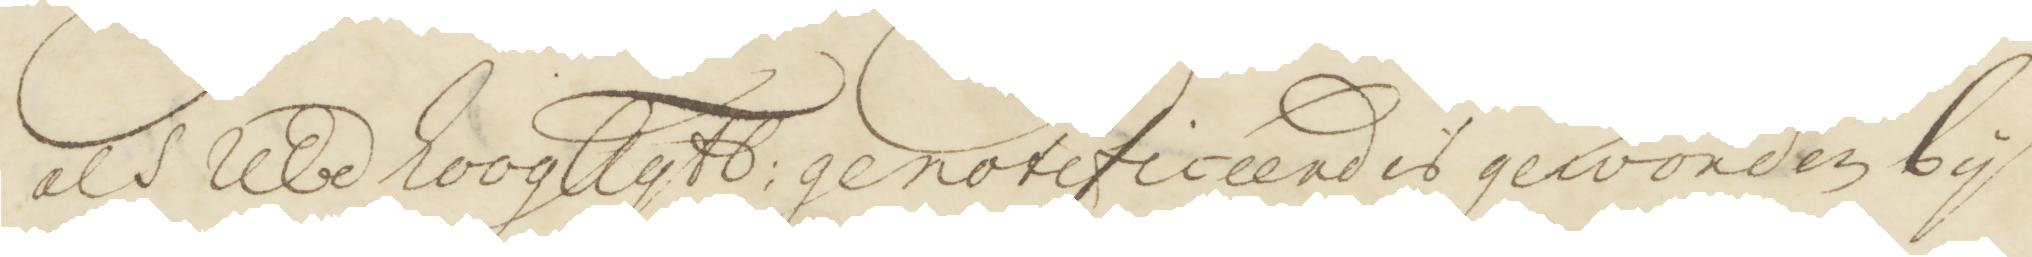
als UEd hoog Agtb: genotificeerd is geworden bij
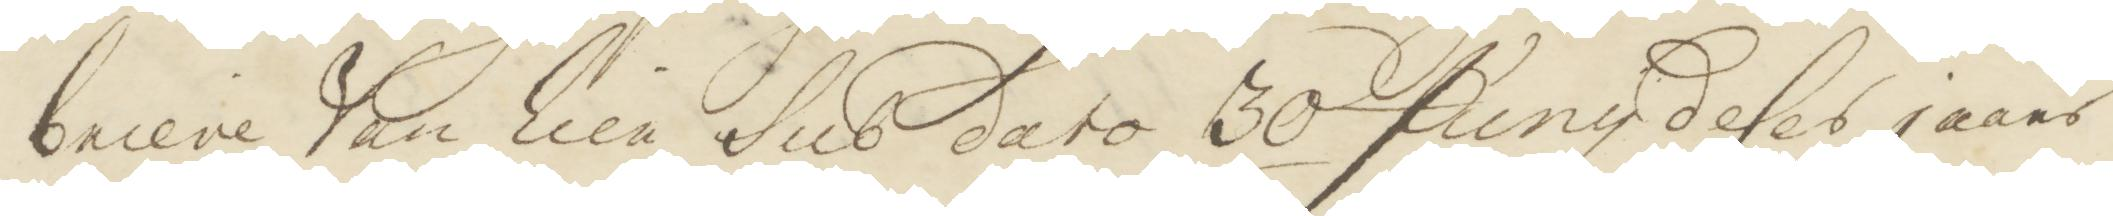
brieve van hier sub dato 30 Junij deses jaars
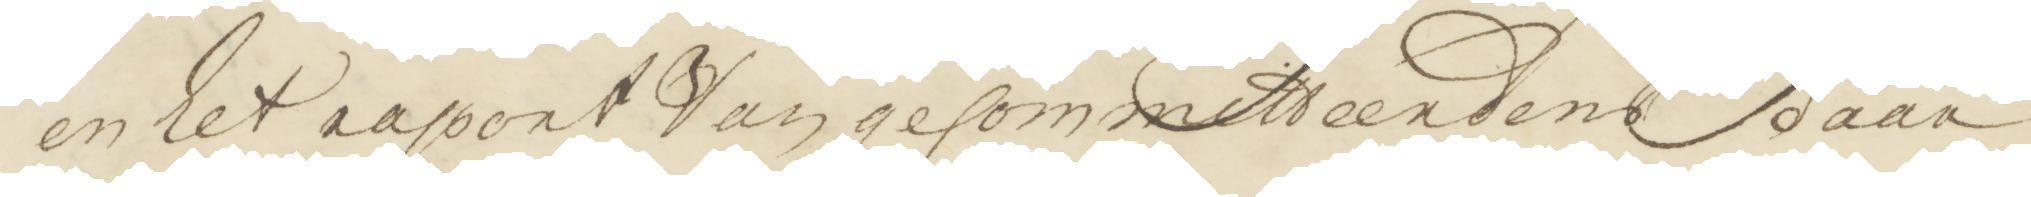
en het raport van gecommitteerdens daar
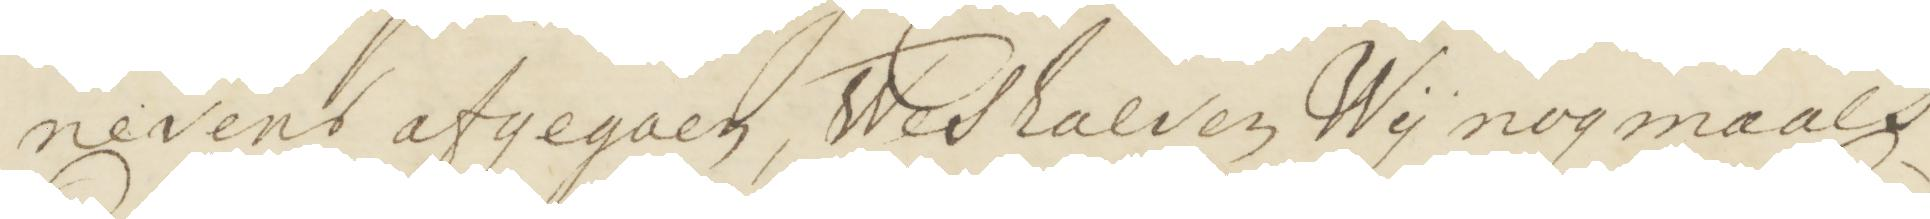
nevens afgegaen, weshalven wij nog maals
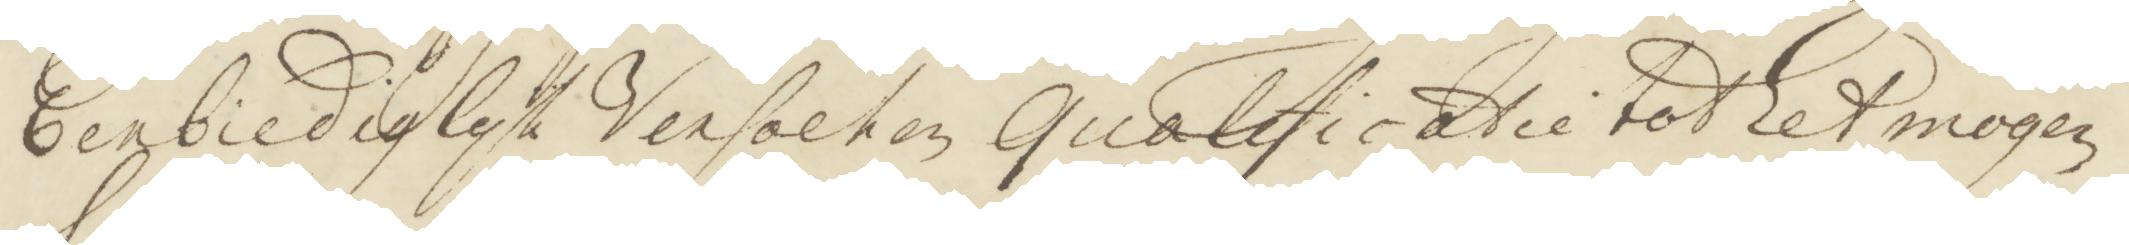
Eerbiediglijk versoeken qualificatie tot het mogen
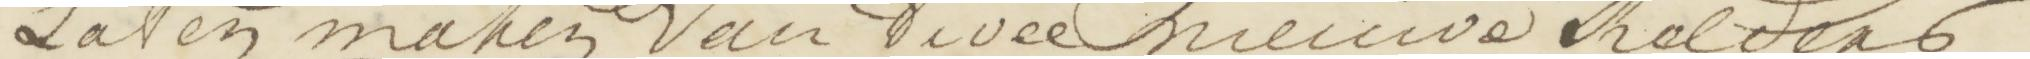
laten maken van twee nieuwe kelders
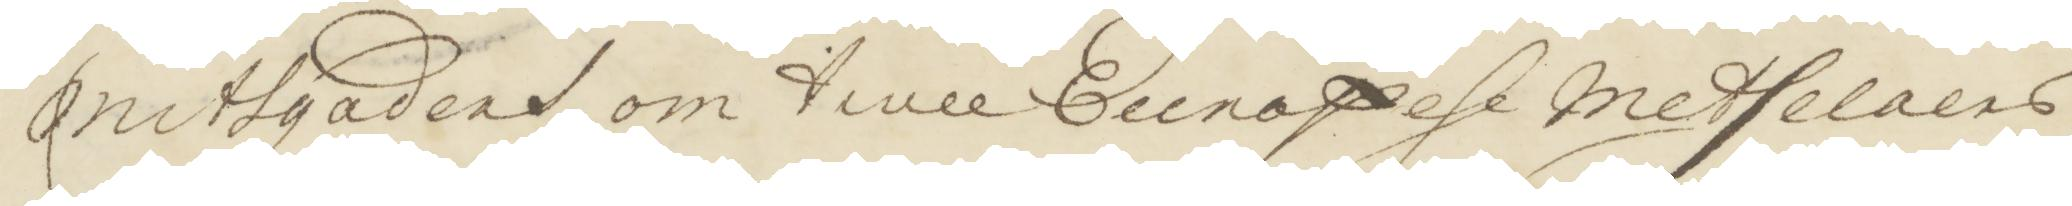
mitsgaders om twee Europese metselaers
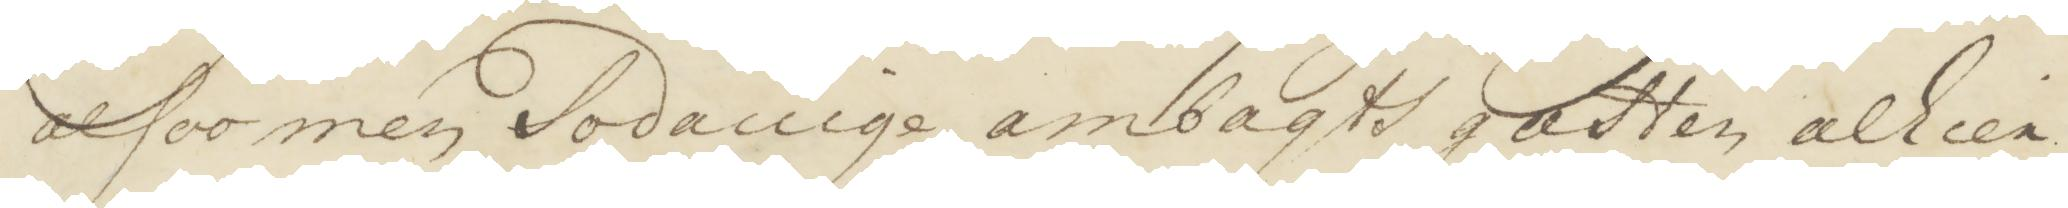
alsoo men sodanige ambagts gasten alhier
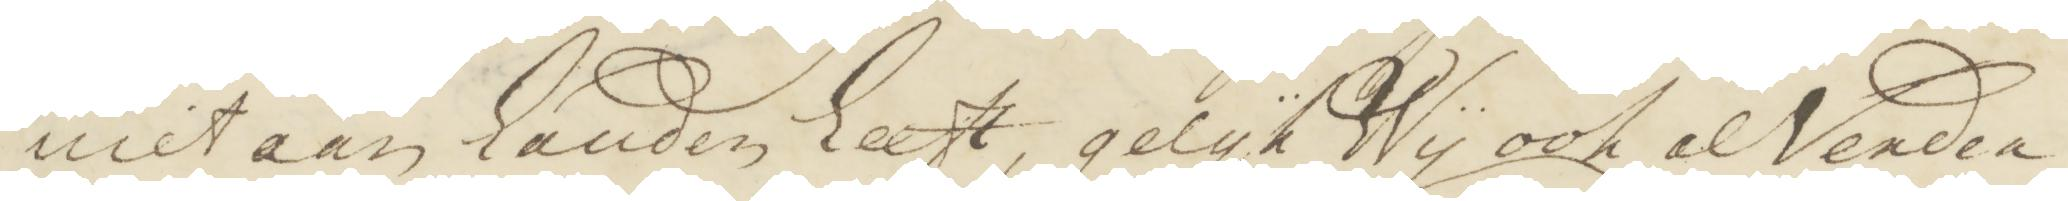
niet aan handen heeft, gelijk wij ook al verder
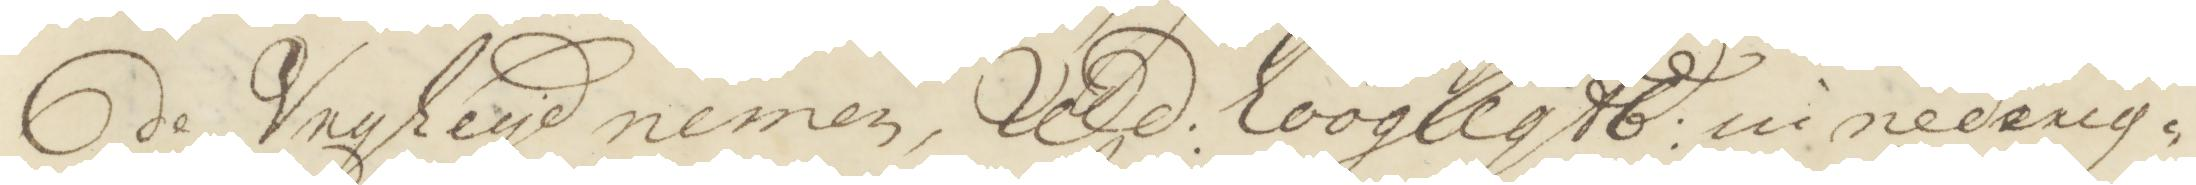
de vryheijd nemen, UEd: hoog agtb: in nederig„
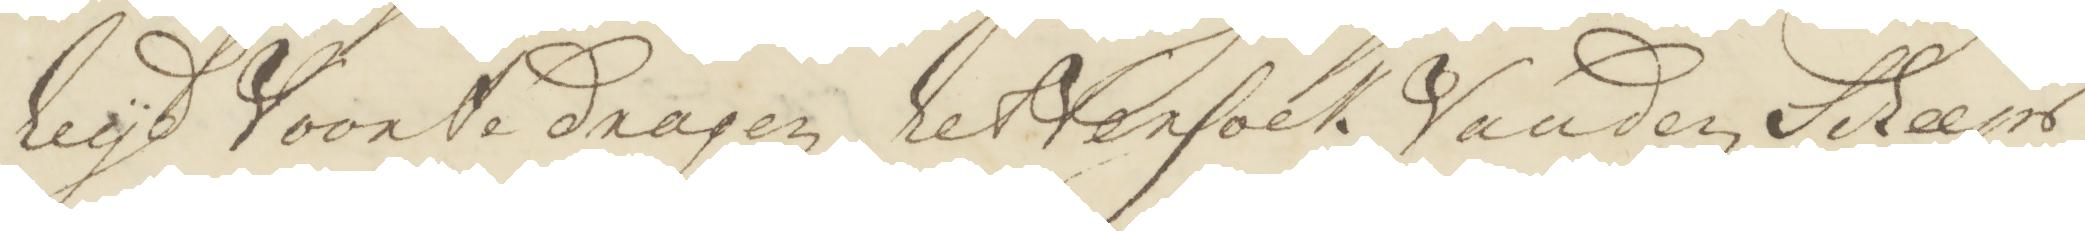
heijd voor te dragen, het versoek van den scheeps
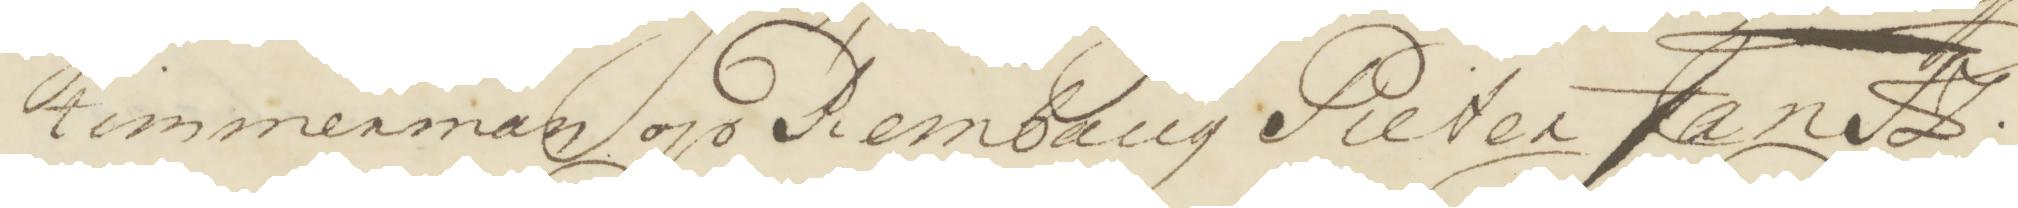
timmerman op Rembang Pieter Jansz.
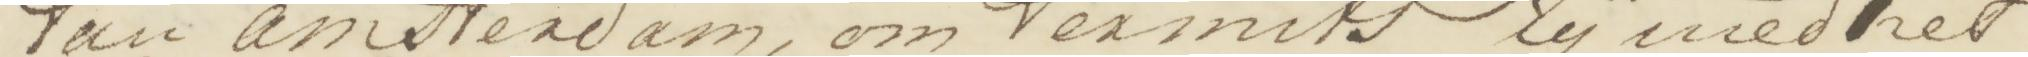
van amsterdam, om vermits hij med het
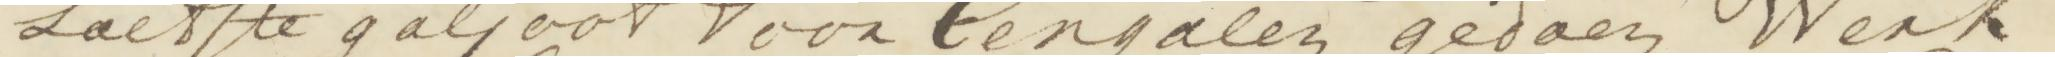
laetste galjoot voor bengalen gedaen werk
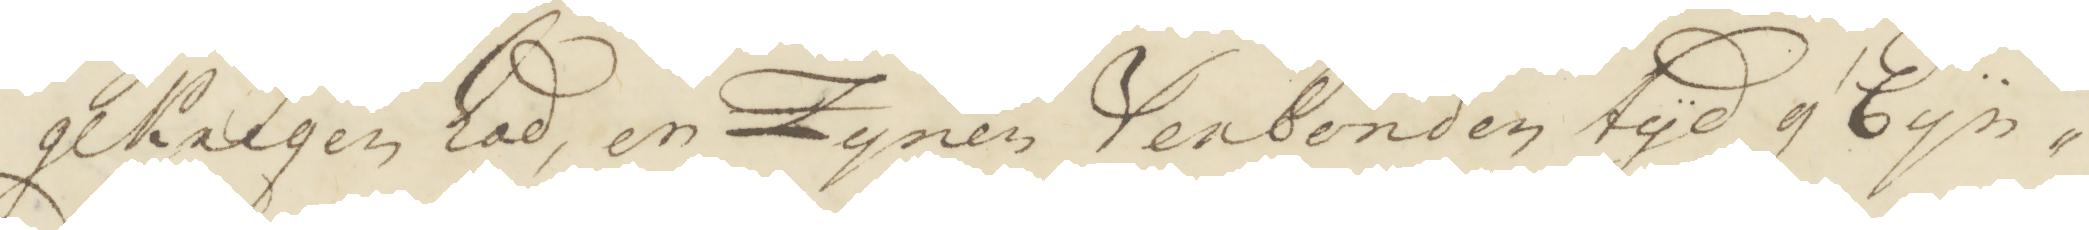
gekregen had, en zynen verbonden tijd g’Eijn„
